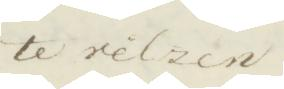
te velzen
